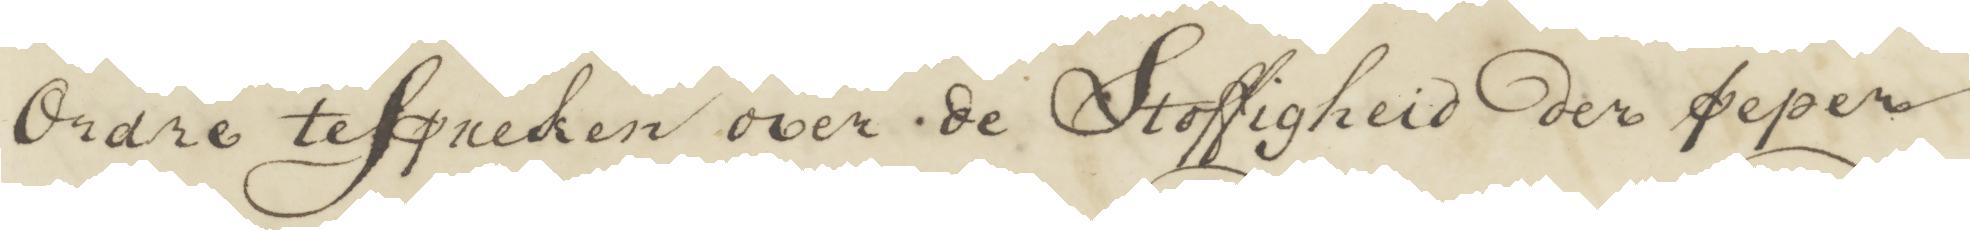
Ordre te spreken over de stoffigheid der peper
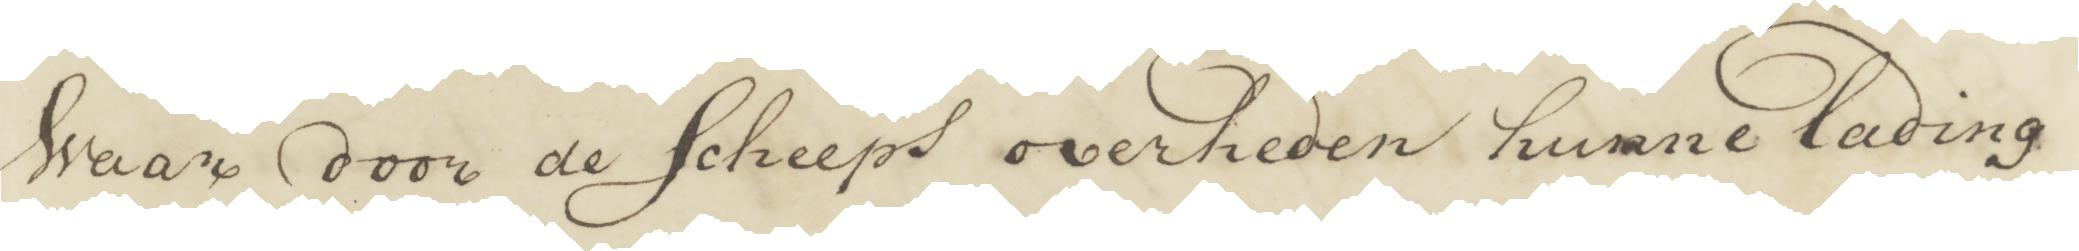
waar door de scheeps overheden hunne lading
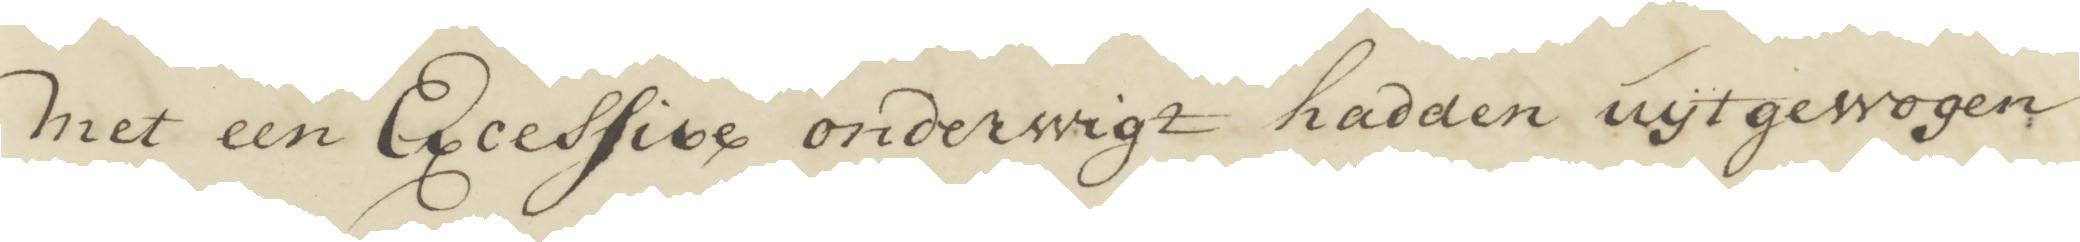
met een Excessive onderwigt hadden uijtgewogen
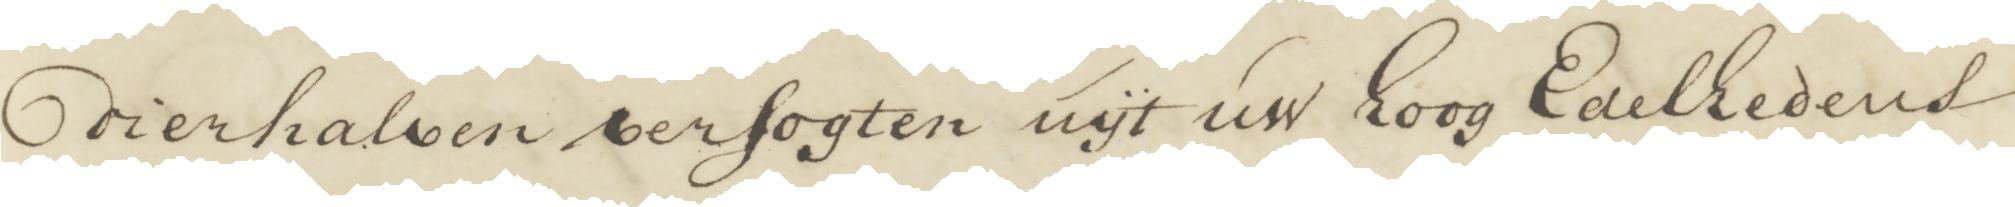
dierhalven versogten uijt uw hoog Edelhedens
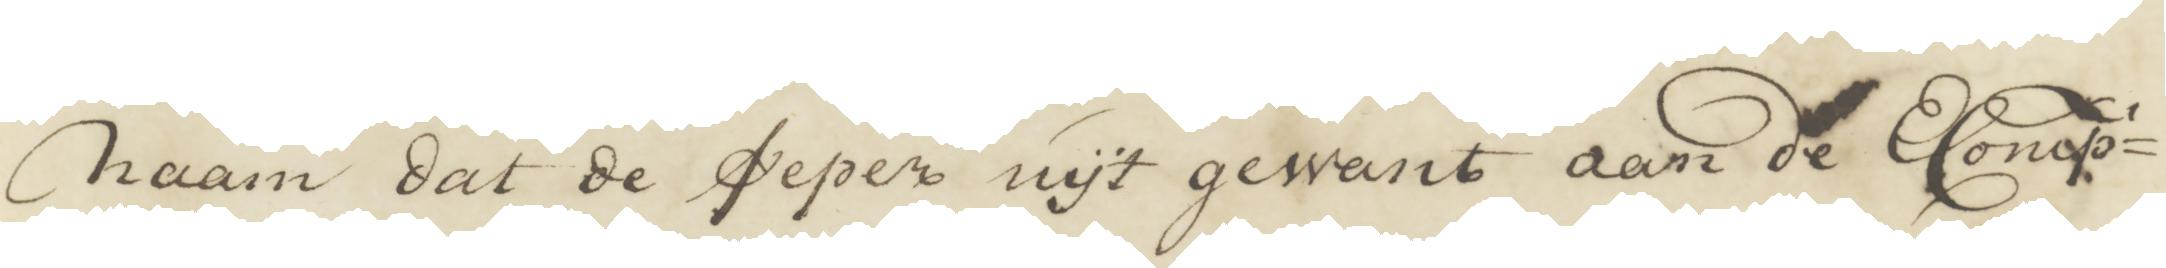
naam dat de peper uijt gewant aan de EComp=s
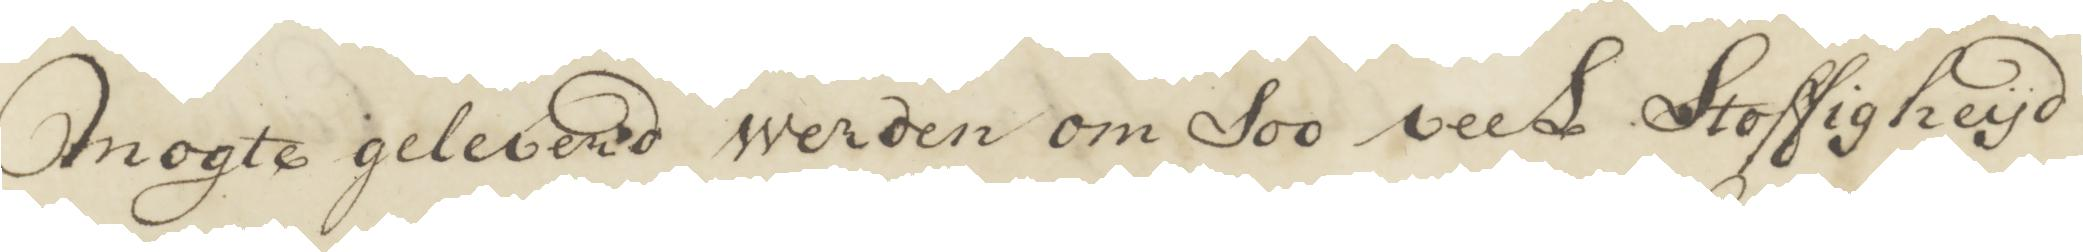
mogte geleverd werden om soo veel stoffigheijd
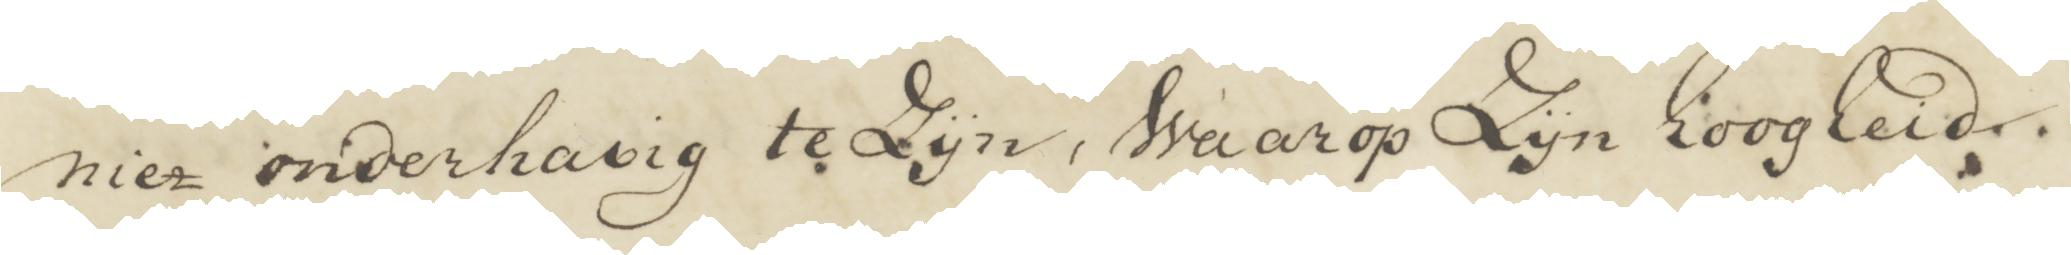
niet onderhavig te zijn, waarop zijn hoogheid
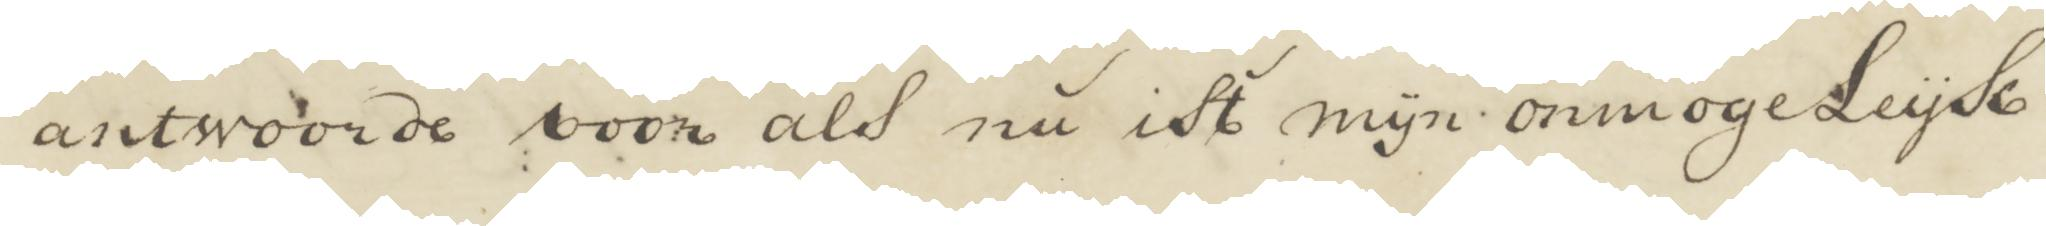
antwoorde voor als nu is't mijn onmogeleijk
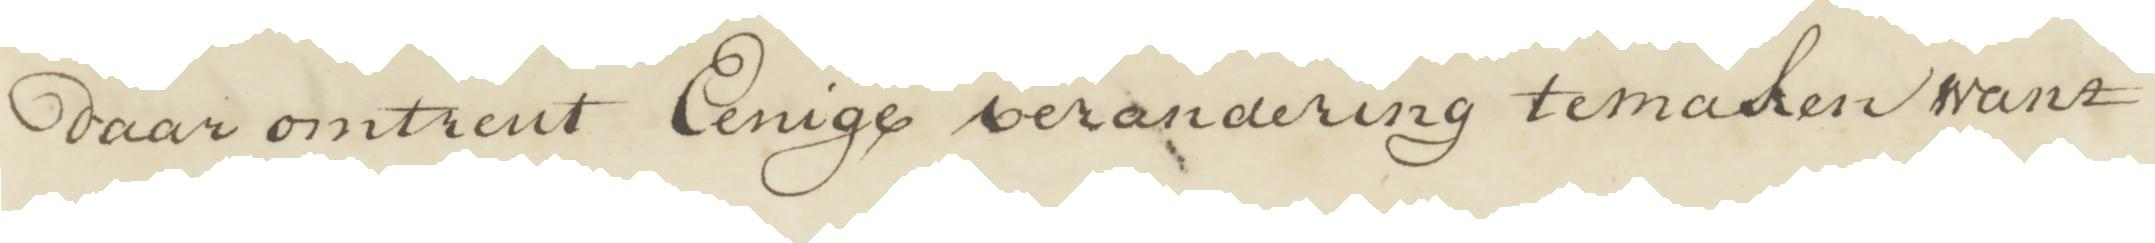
daar omtrent Eenige verandering temaken want
